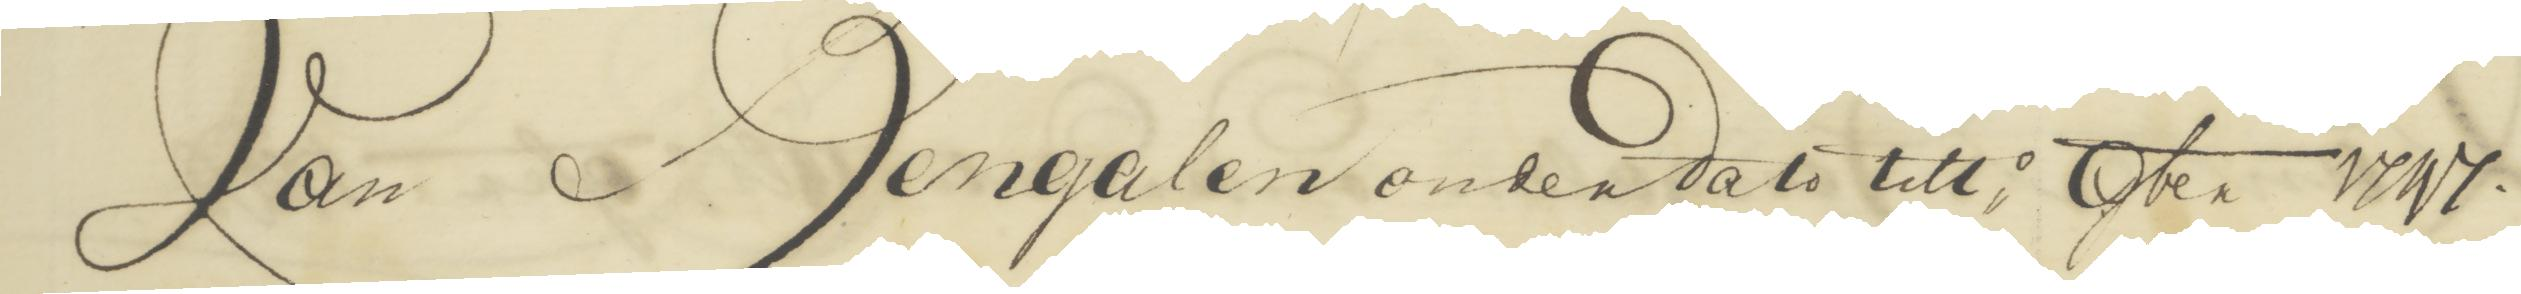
Van Bengalen onder dato ult„o 7ber 1747.
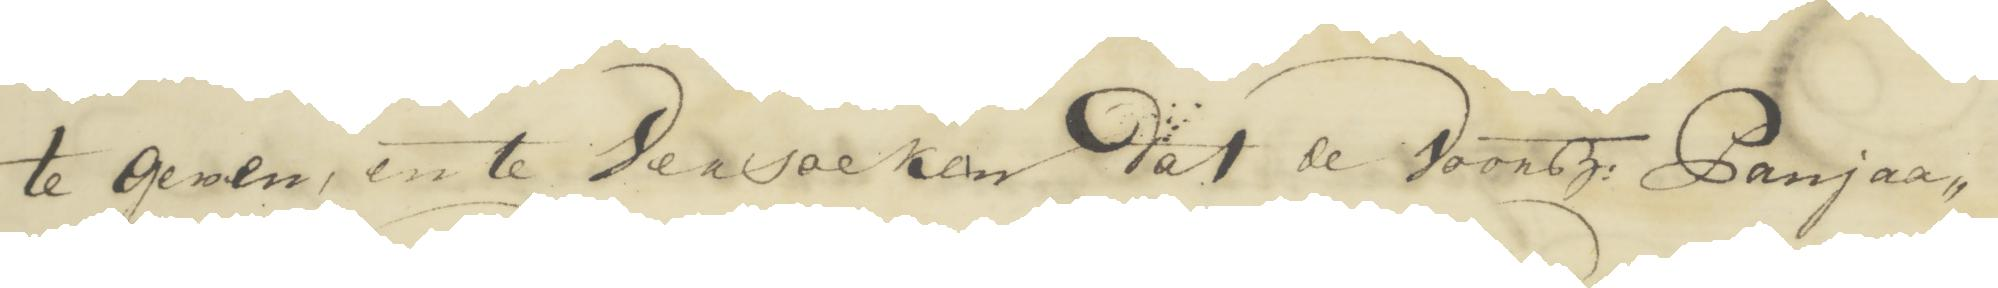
te geven, en te versoeken dat de voorsz: Panjaa„
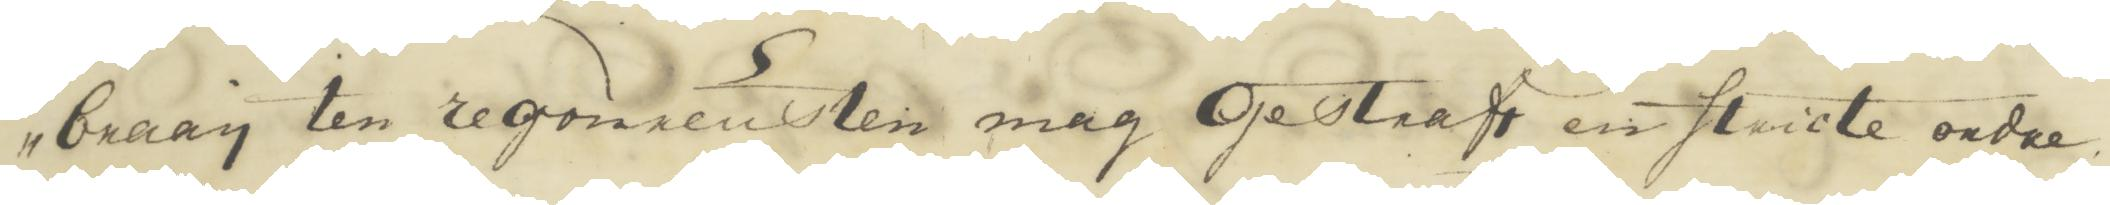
„braaij ten regoureusten mag gestraft en stricte ordre
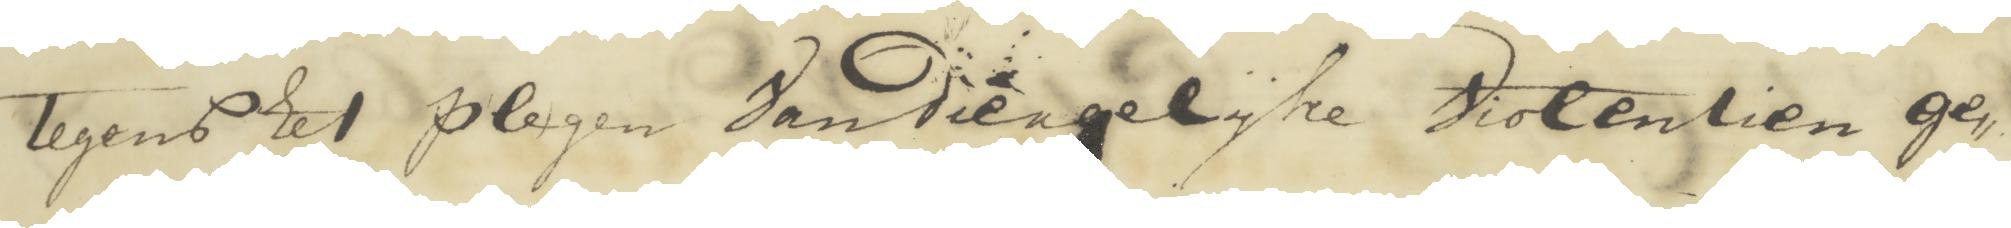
tegens het plegen van diergelijke violentien ge„
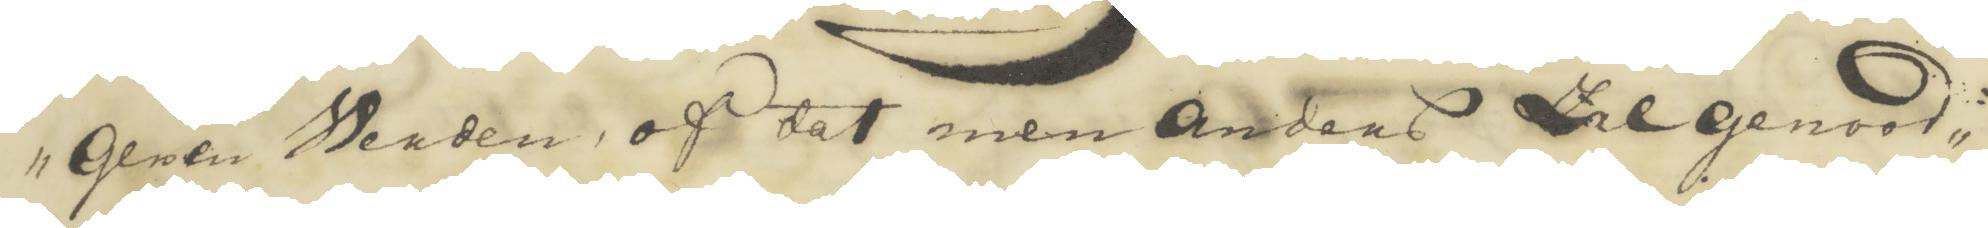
„geven Werden, of dat men anders zal genood„
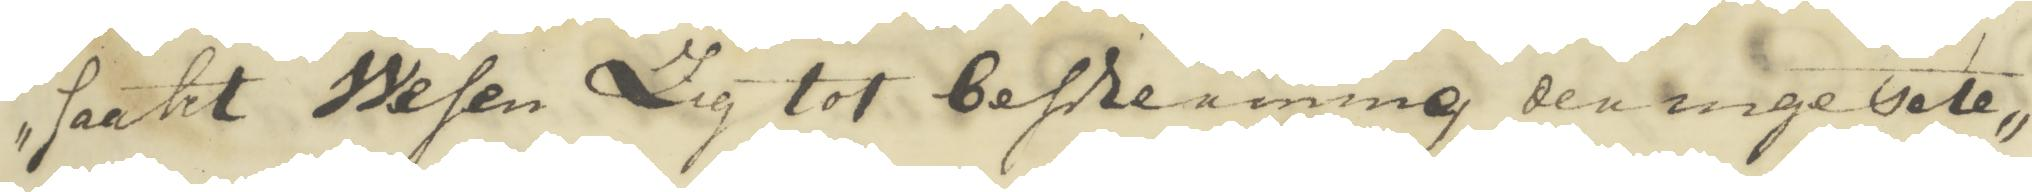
„saakt Wesen zig tot bescherming der ingesete„
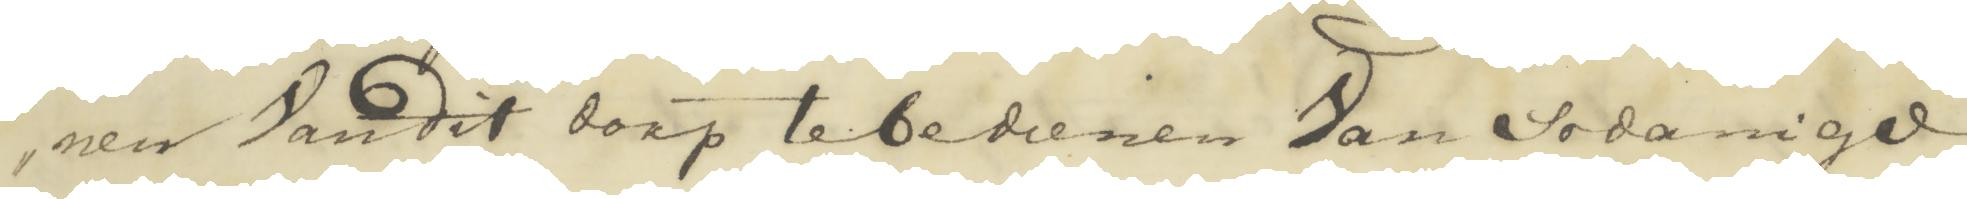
„nen van dit dorp te bedienen van sodanige
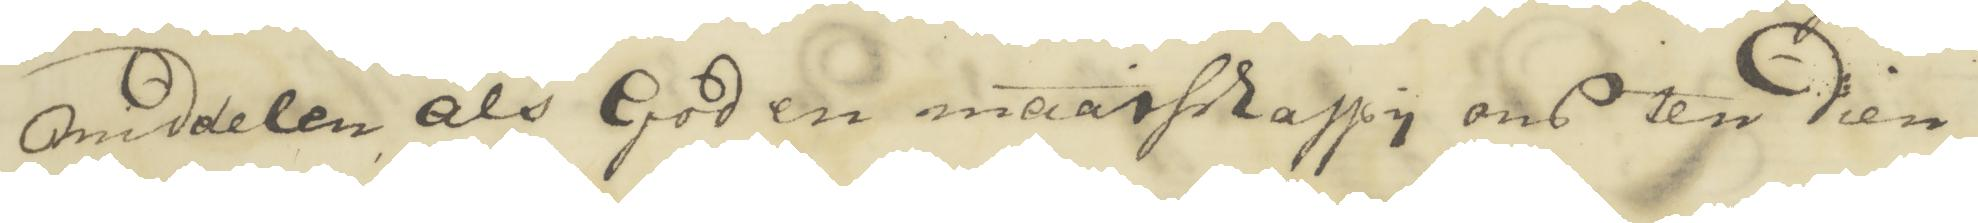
middelen als God en maatschappij ons ten dien
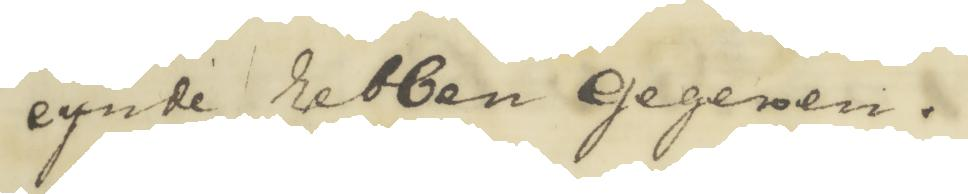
eijnde hebben gegeven.
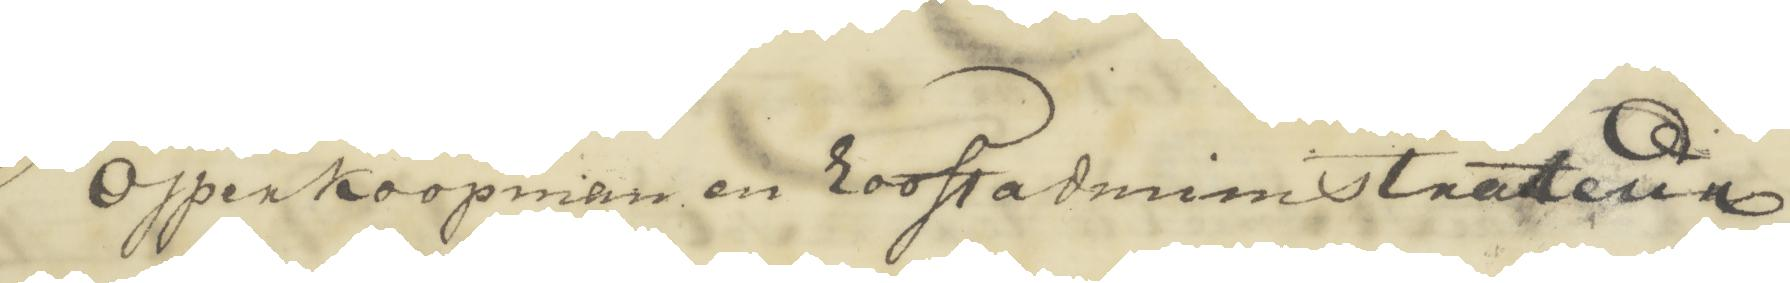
D' opperkoopman en hooftadministrateur
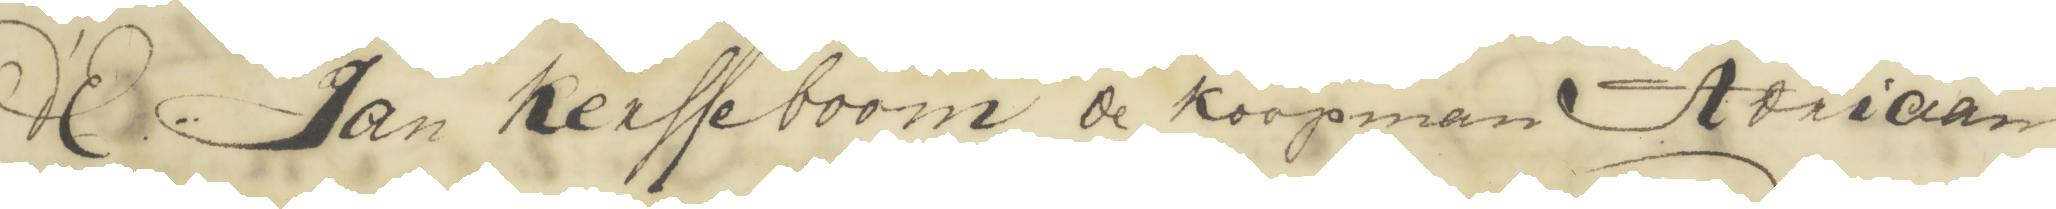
d' E. Ian Kersseboom de koopman Adriaan
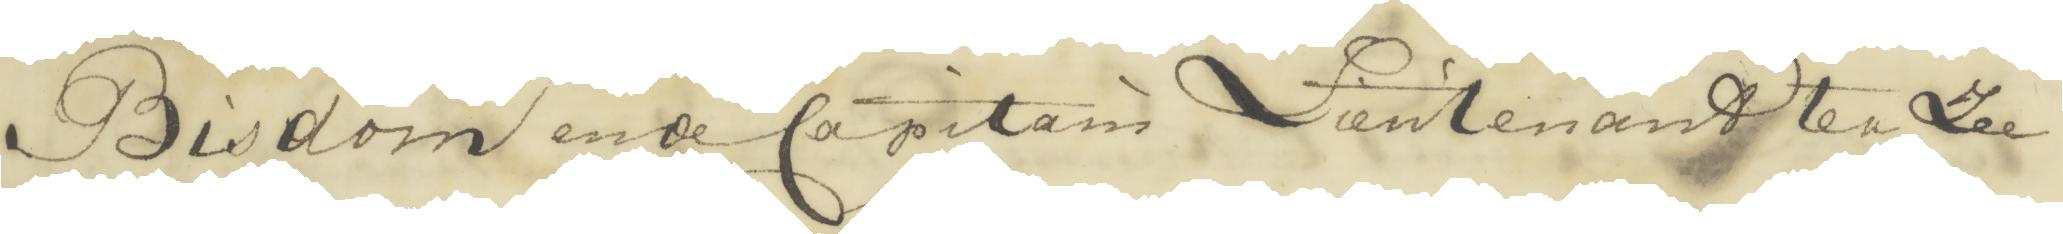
Bisdom ende Capitain Lieutenant ter zee
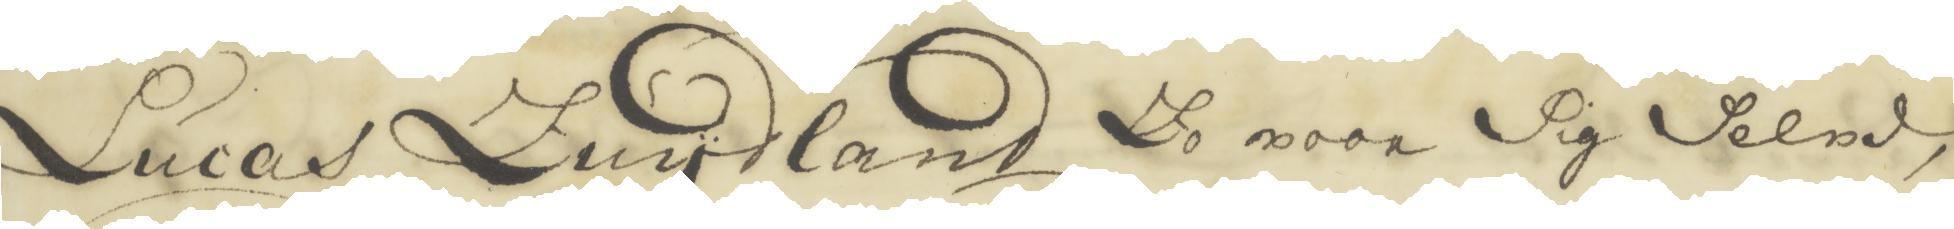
Lucas Zuijdland zo voor sig selve,
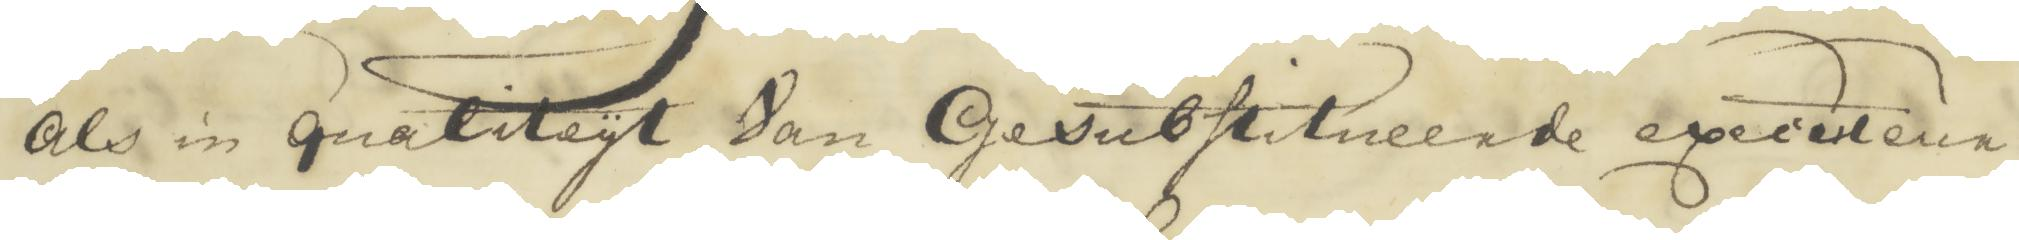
als in qualiteijt van gesubstitueerde executeur
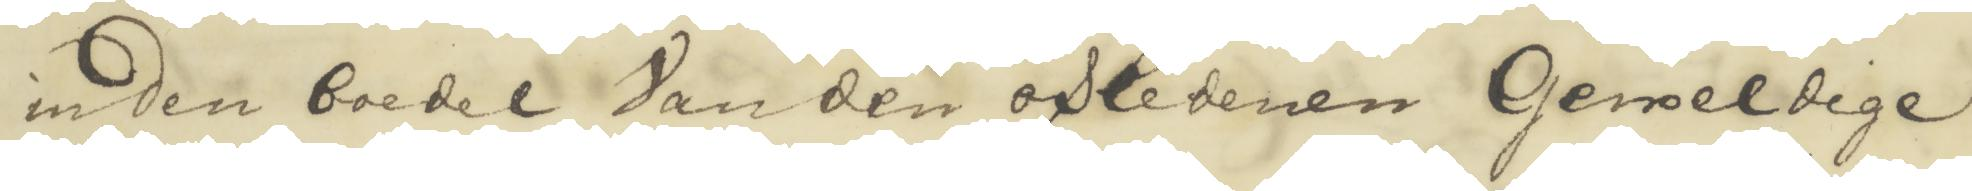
in den boedel van den overledenen Geweldige
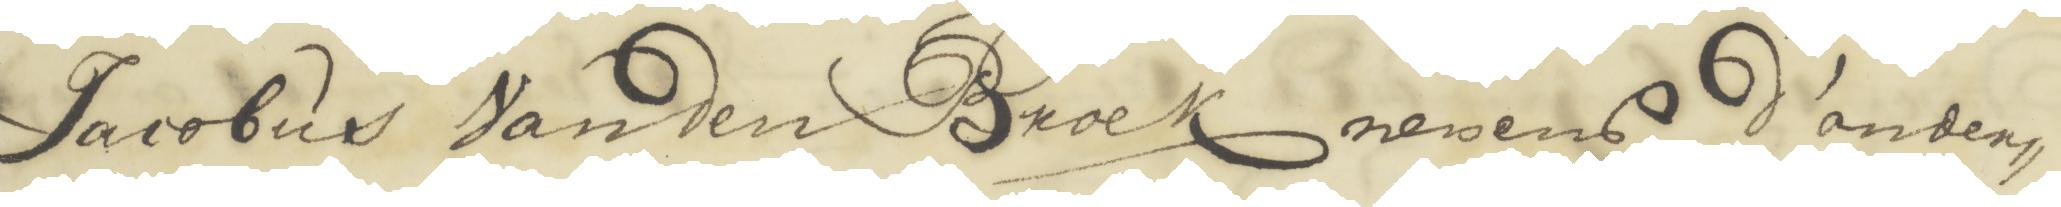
Iacobus van den Broek nevens d’onder„
